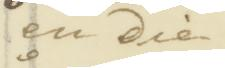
en die
